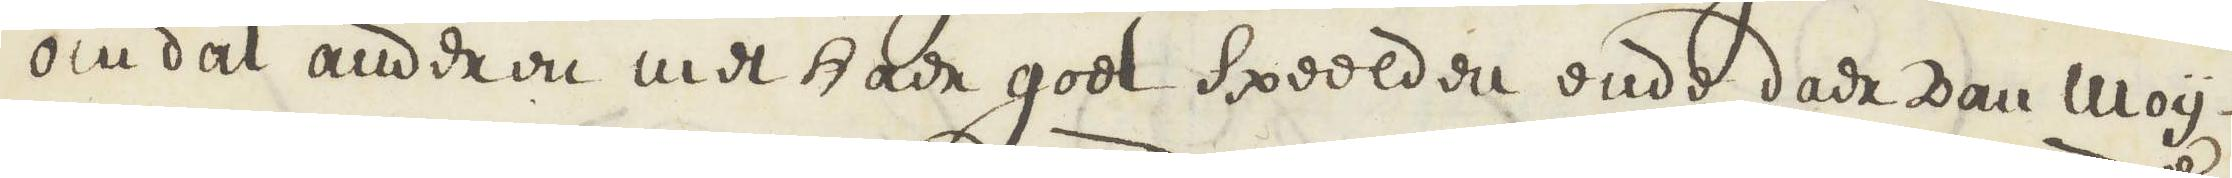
om dat anderen met haer goet speelden ende daer van moij
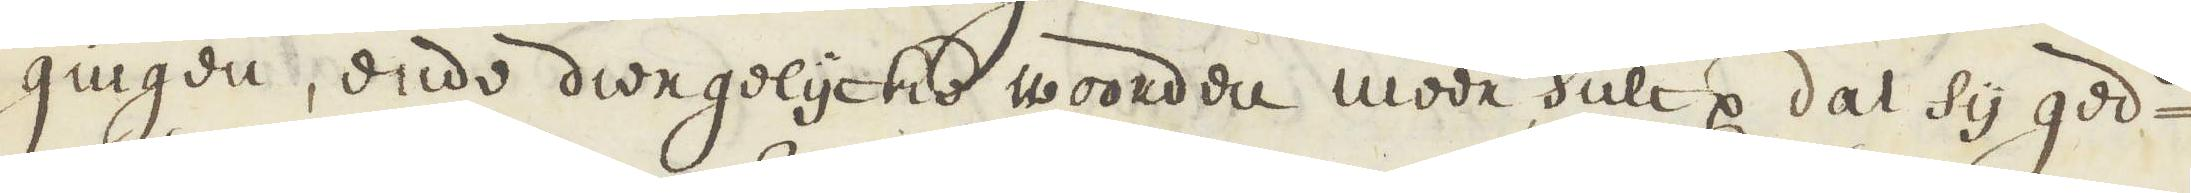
gingen, ende diergelijcke woorden meer sulcx dat sij ged=e
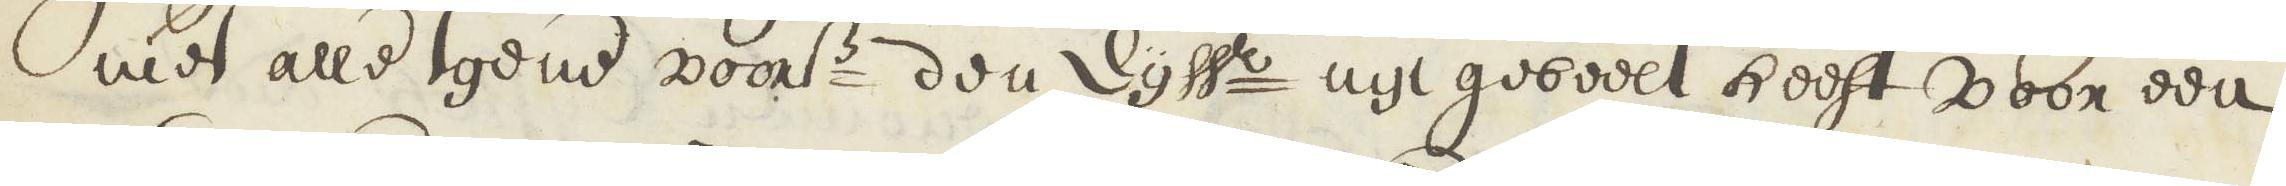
niet alle tgene voors=z den Eijss=r uyt gebeelt heeft voor een
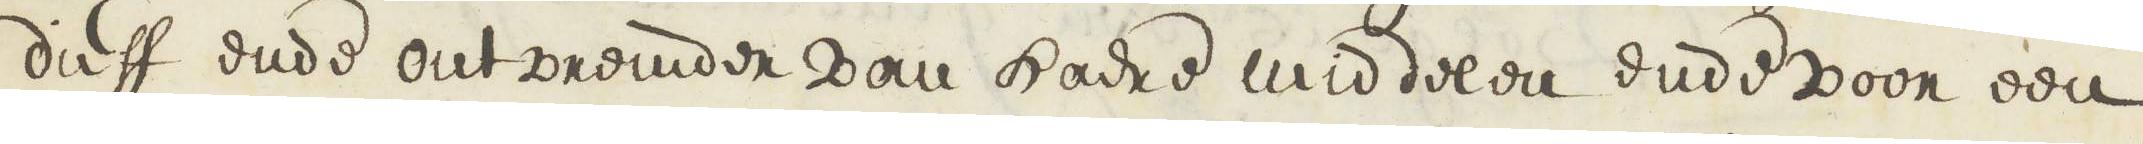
dieff ende ontvremder van haere middelen ende voor een
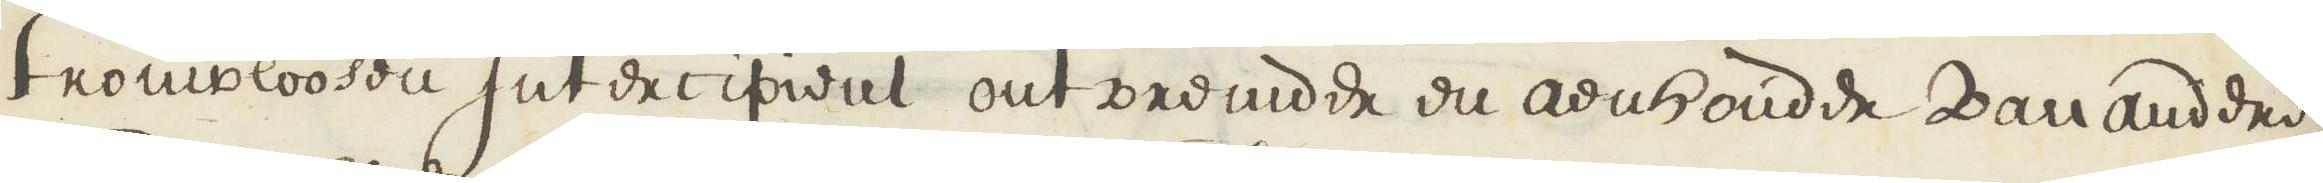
trouwloosen jntercipient ontvremder en aenhouder van andere
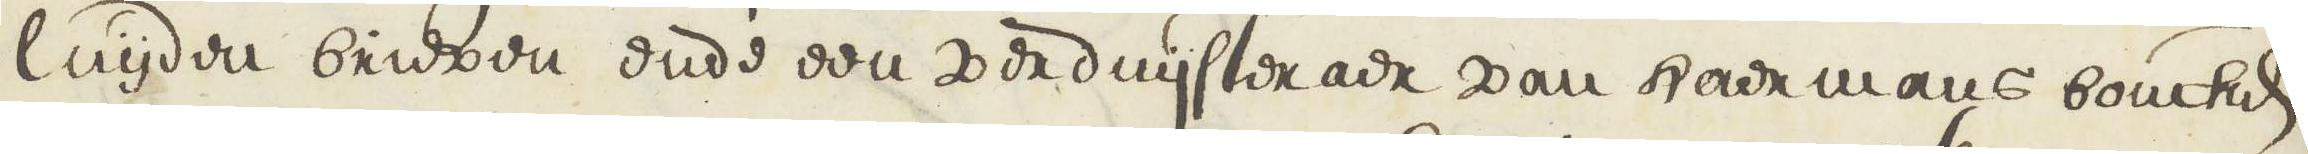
luijden brieven ende een verduijsteraer van haer mans boucken
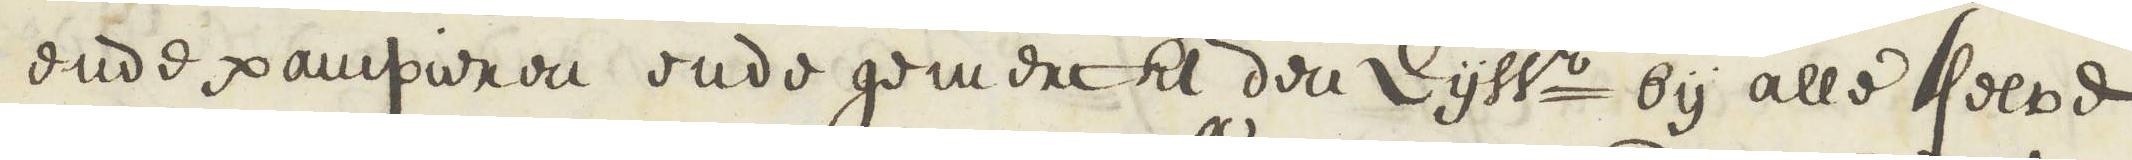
ende pampieren ende gemerckt den Eijss=r bij alle tselve
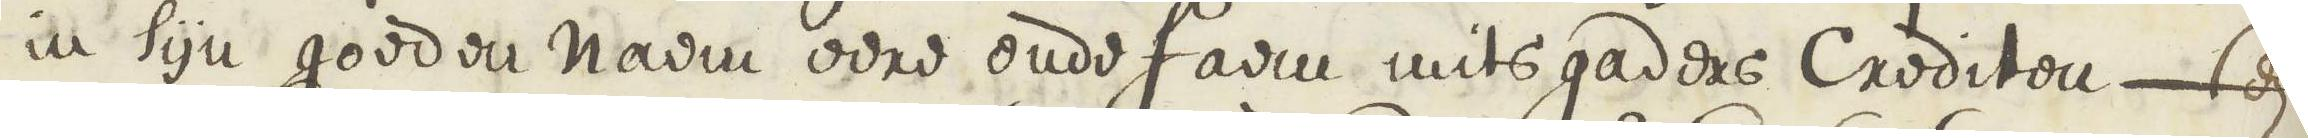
in sijn goeden naem eere ende faem mits gaders Crediten ten
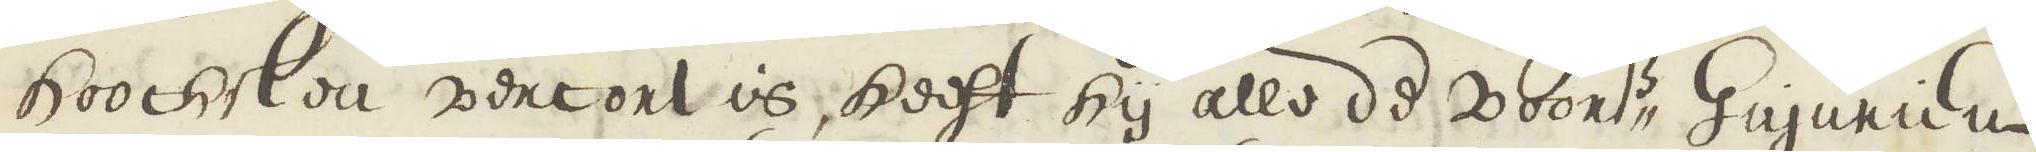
hoochsten vercort is, heeft hij alle de voors„z Jnjurien
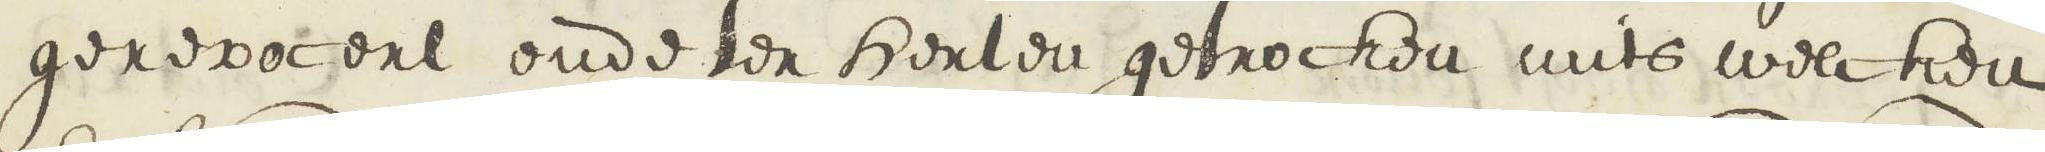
gerevocert ende ter herten getrocken mits welcken
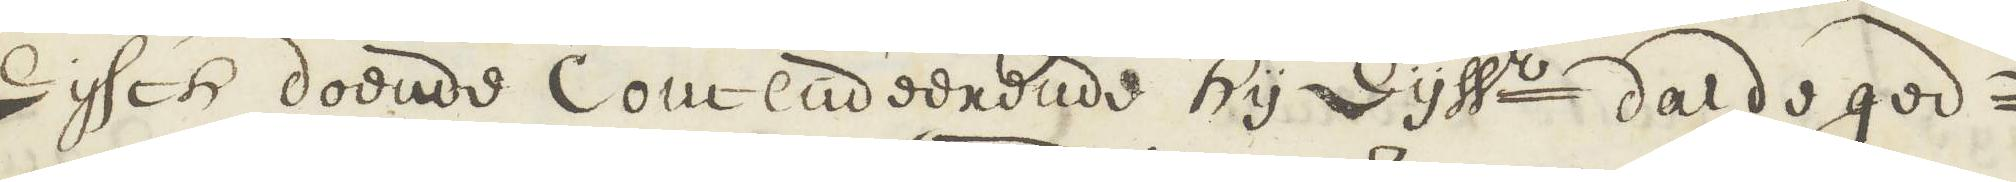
Eijsch doende Concludeerende hij Eijss=r dat de ged=e
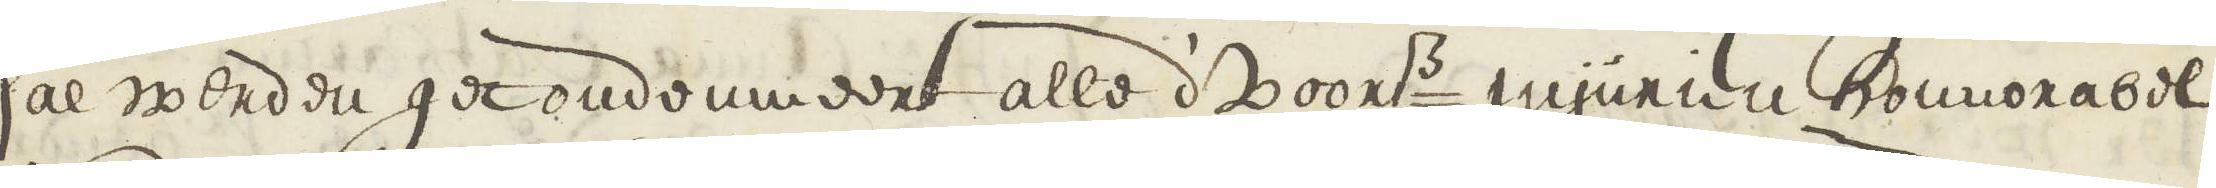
al werden gecondemneert alle d’ voors=z jnjurien honnorabel
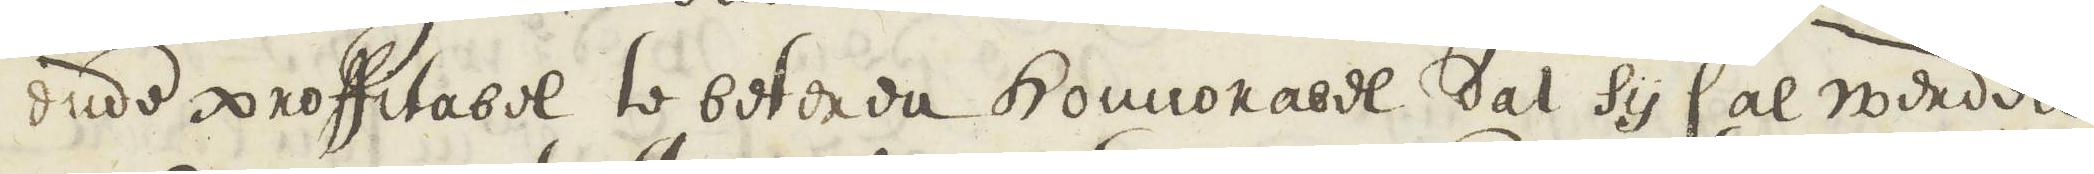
ende proffitabel te beteren honnorabel dat sij sal werden
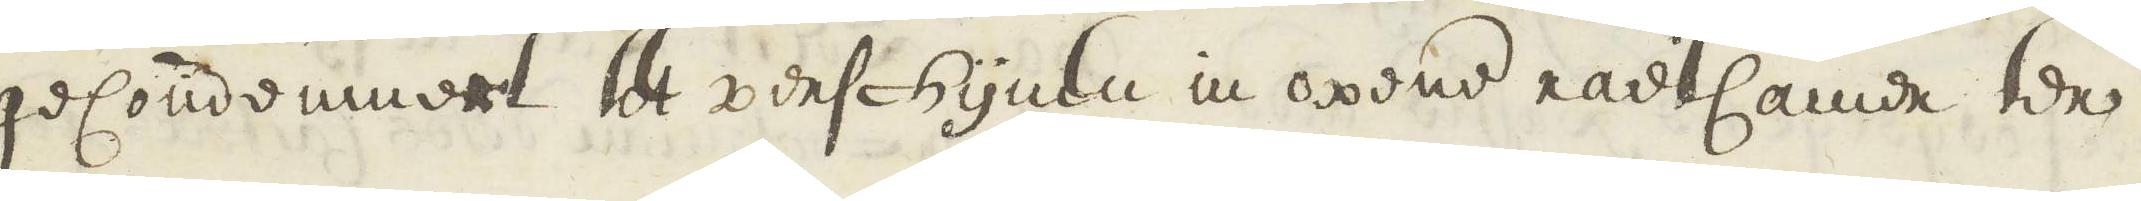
gecondemnert tot verschijnen in opene raetcamer ter
